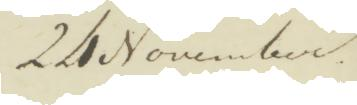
24 November.
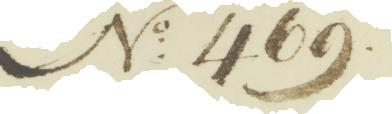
N:o 469.
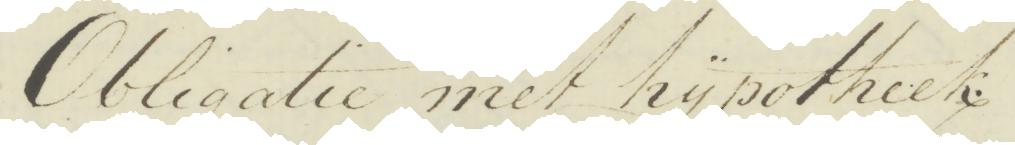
Obligatie met hijpotheek.
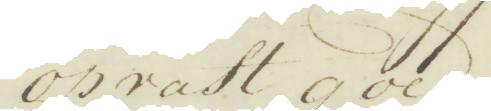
op vast goed
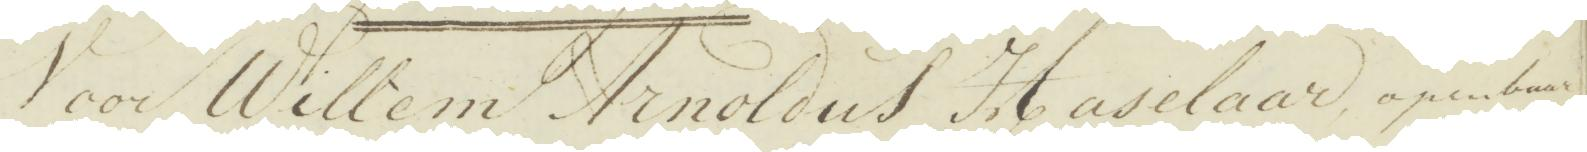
Voor Willem Arnoldus Haselaar, openbaar
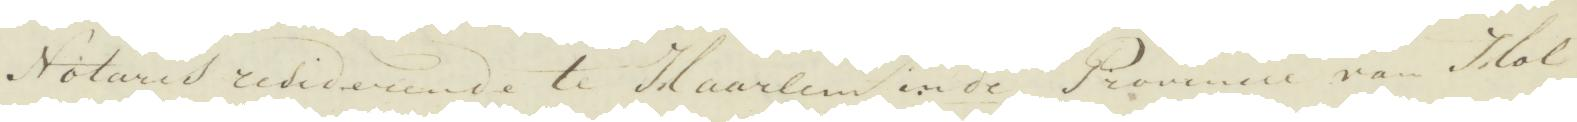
Notaris residereende te Haarlem in de Provincie van Hol
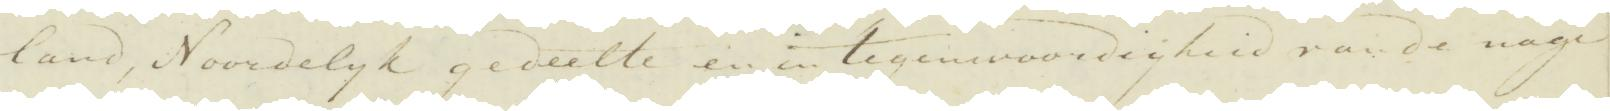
land, Noordelyk gedeelte en in tegenwoordigheid van de nage
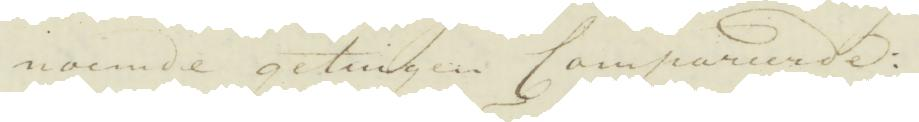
noemde getuigen Compareerde:
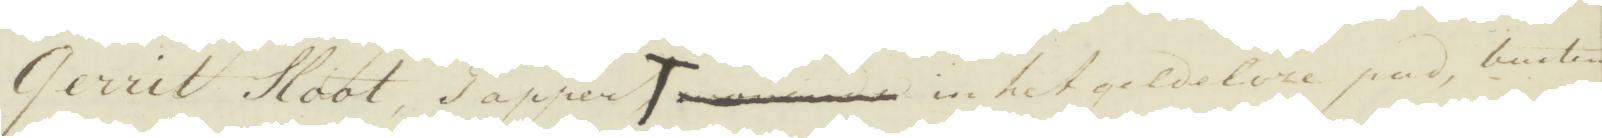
Gerrit Sloot, Tapper T wonende in het geldeloze pad, buiten
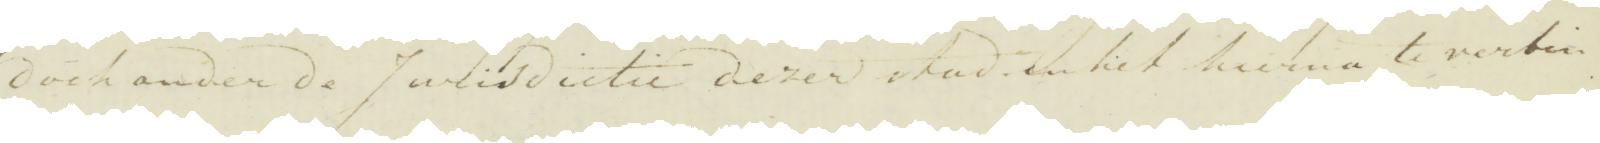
doch onder de Jurisdictie dezer stad, in het hierna te verbin
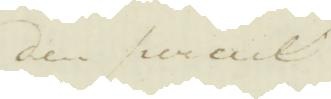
den perceel
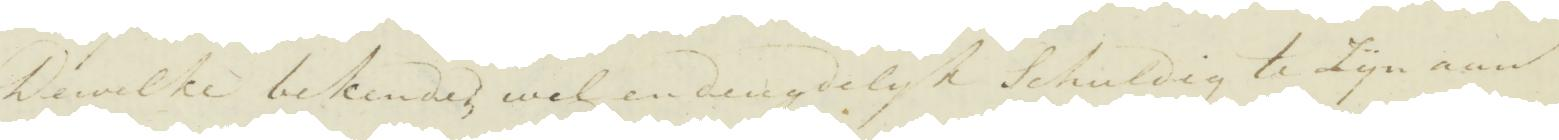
Dewelke bekenden wel en deugdelyk schuldig te zijn aan
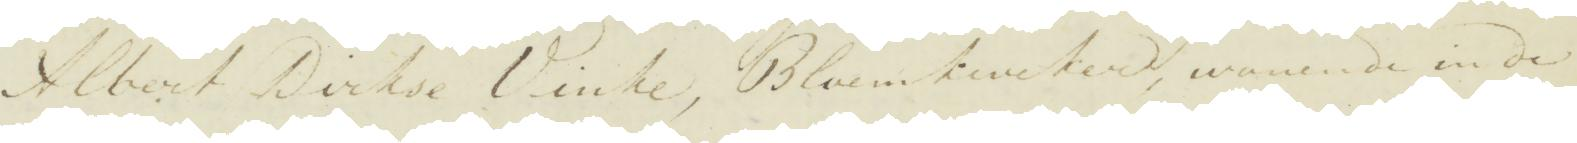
Albert Dirkse Vinke, Bloemkweker, wonende in de
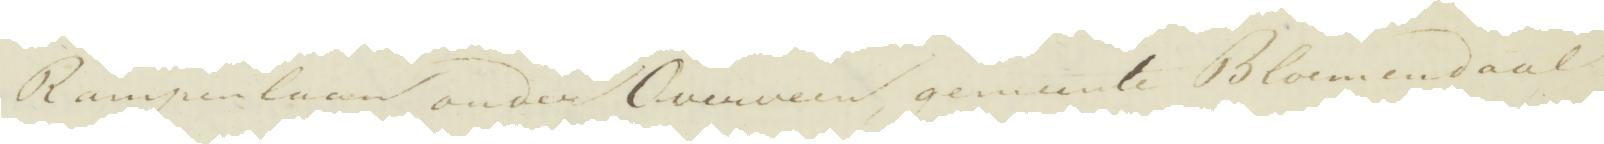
Rampenlaan onder Overveen, gemeente Bloemendaal
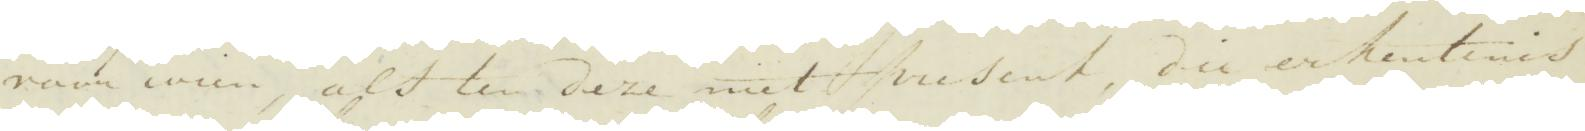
van wien, als ten deze niet present, die erkentenis
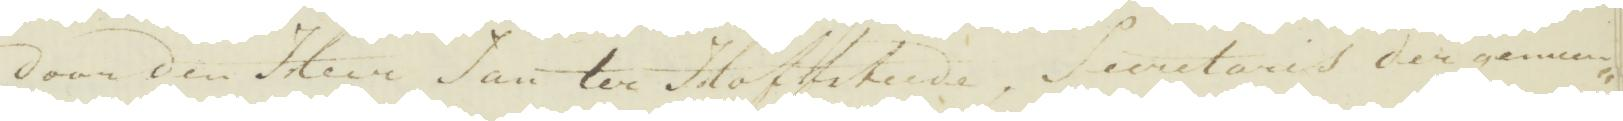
door den Heer Jan ter Hoffsteede, Secretaris der gemeen
